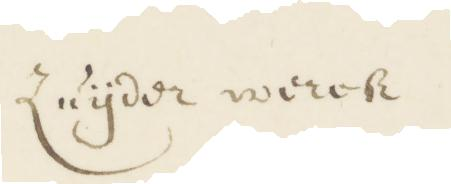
Zuijder werck
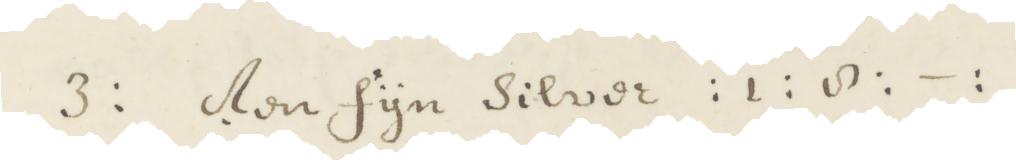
3: Aen fijn silver : 1 : 8 : — :
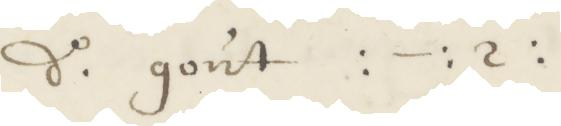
d.o gout : — : 2 :
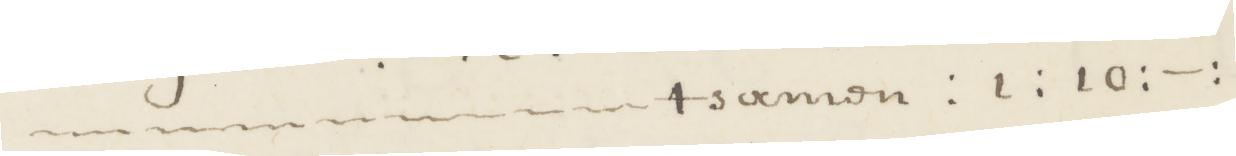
t samen : 1 : 10 : — :
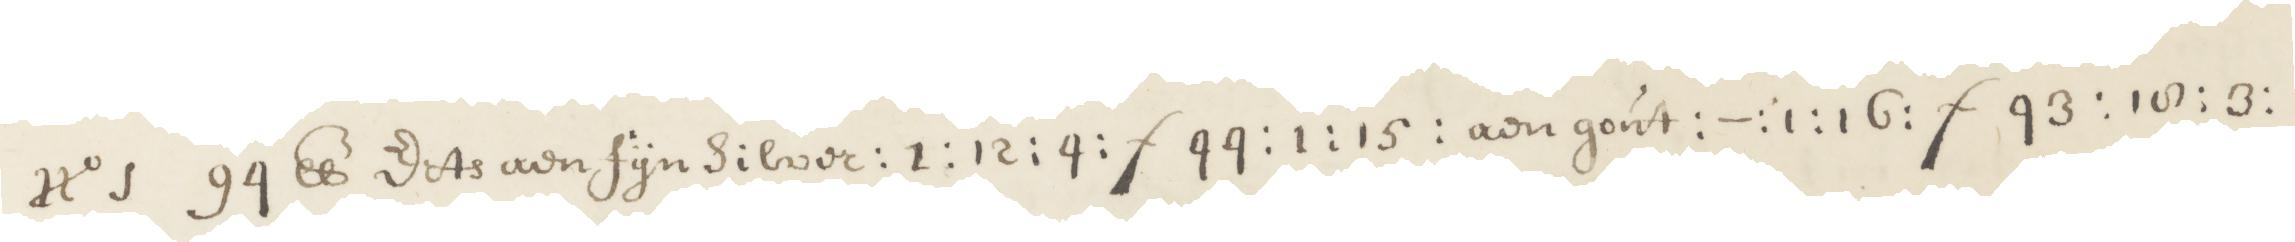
No 1 94 lb Erts aen fijn silver : 1 : 12 : 4 : ƒ 44 : 1 : 15 : aen gout : — : 1 : 16: ƒ 93 : 18:3:
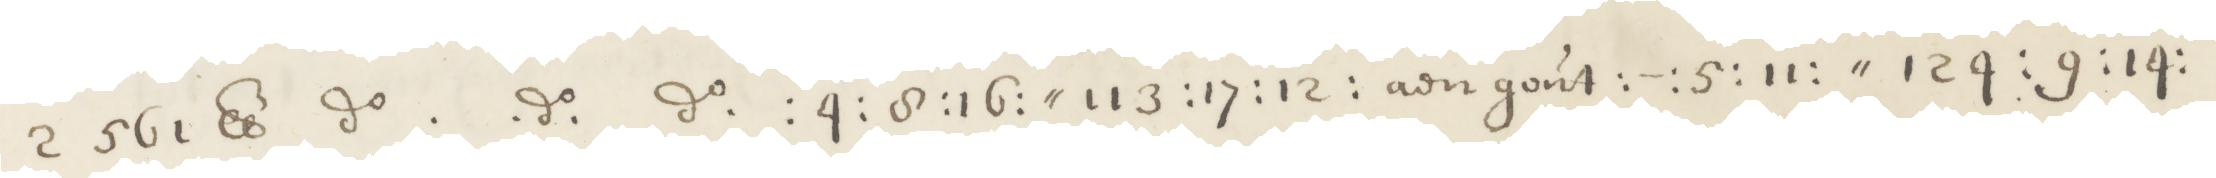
2 561 lb do . . d.o d.o : 4 : 8 :16 : „ 113 : 17 : 12 : aen gout : — : 5 : 11 : „ 124 : 9 : 14:
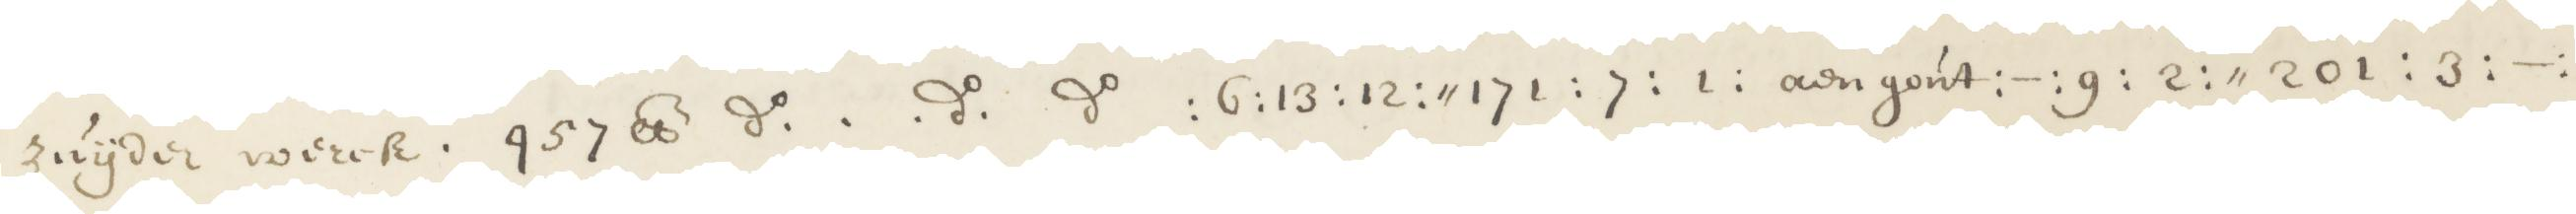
zuijder werck . 457 lb d.o . . d.o do : 6 :13 : 12 : „ 171 : 7 : 1 : aen gout : — : 9 : 2 : „ 201 : 3 :—
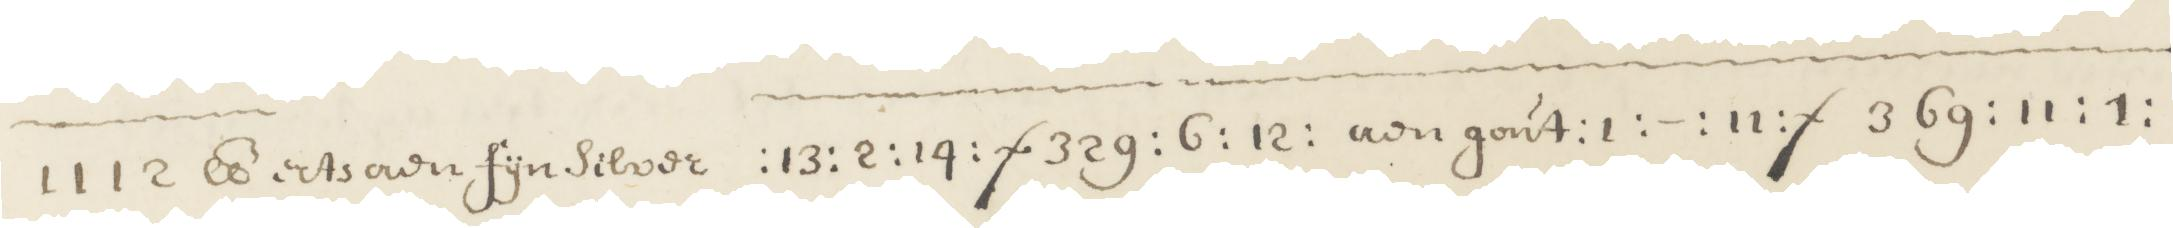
1112 lb erts aen fijn silver :13:2:14: ƒ 329:6:12: aen gout : 1 : — : 11 : ƒ 369 : 11 : 1 :
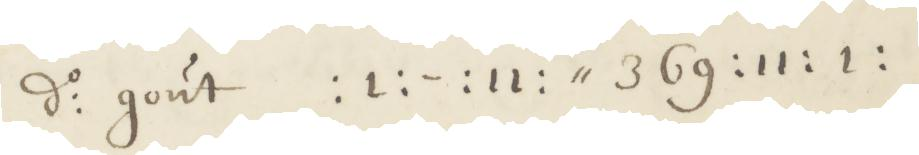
d:o gout : 1 : - : 11 : „ 369 : 11 : 1 :
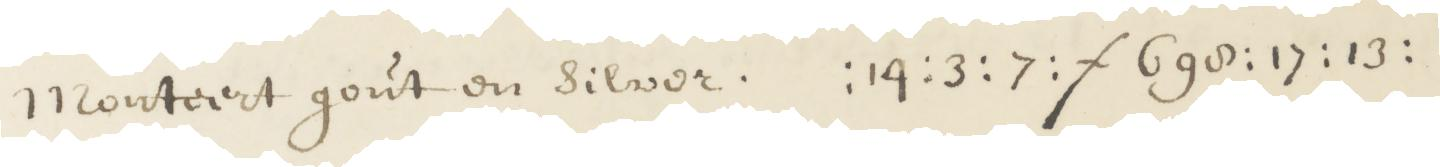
Monteert gout en silver. :14:3:7: ƒ 698:17:13:
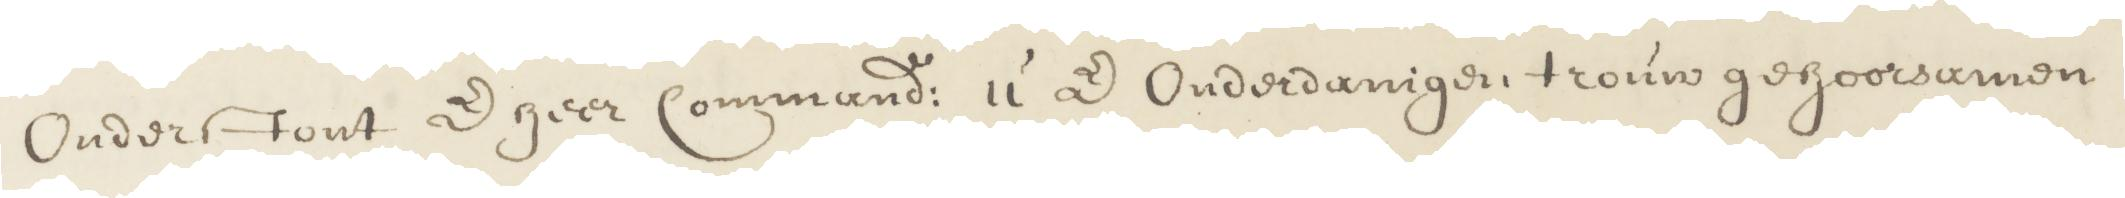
Onderstont E heer Command: u E Onderdanigen trouw gehoorsamen
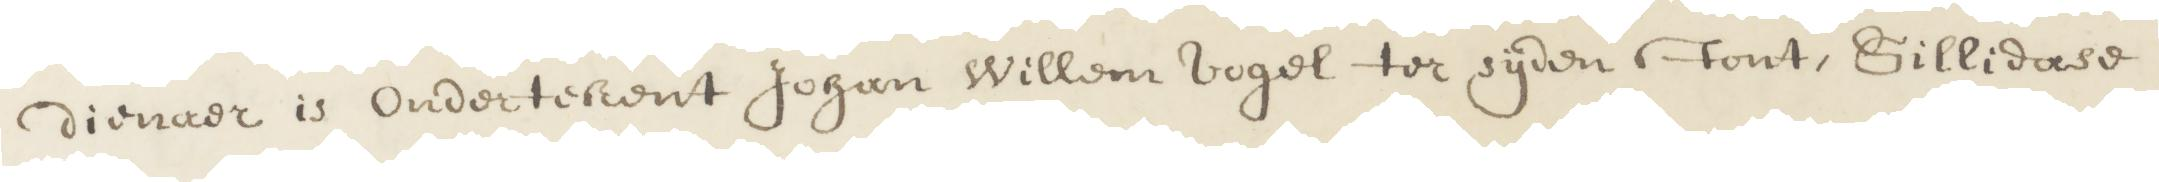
dienaer is ondertekent Johan Willem vogel ter sijden stont, Sillidase
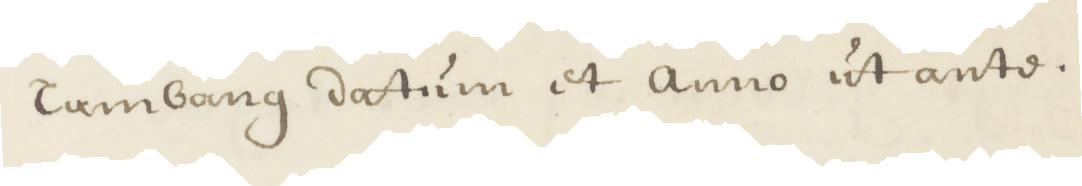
Tambang datum et Anno ut ante
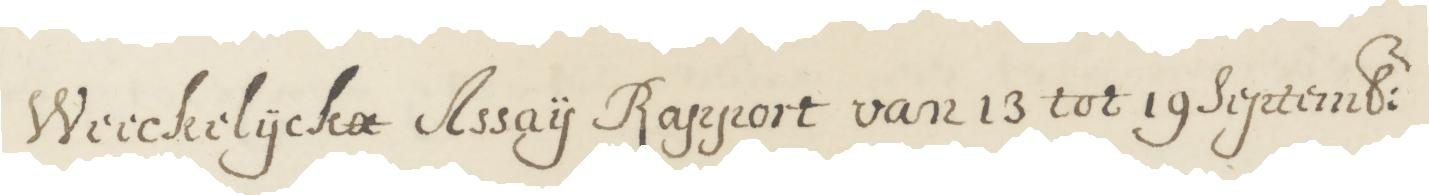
Weeckelijckx Assaij Rapport van 13 tot 19 Septemb:
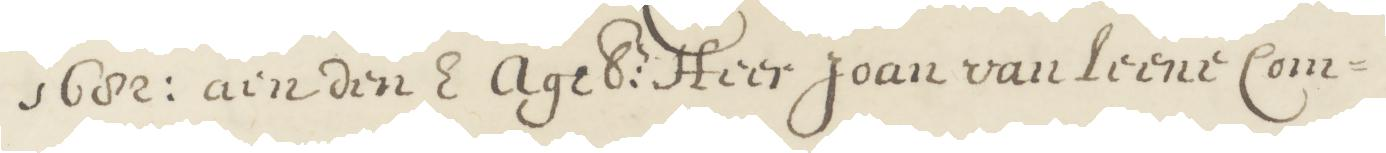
1682: aen den E Agtb: Heer Joan van Leene Com=
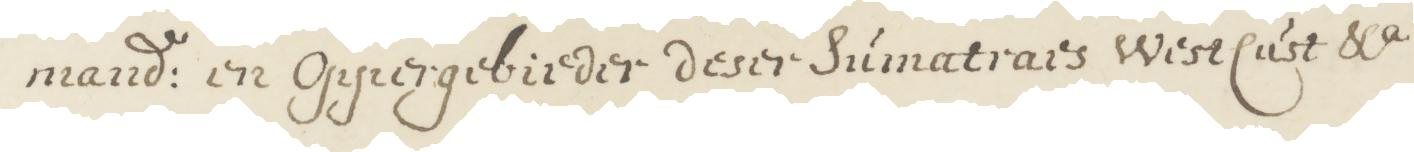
mand: en Oppergebieder deser Sumatraes westcust &Ca
